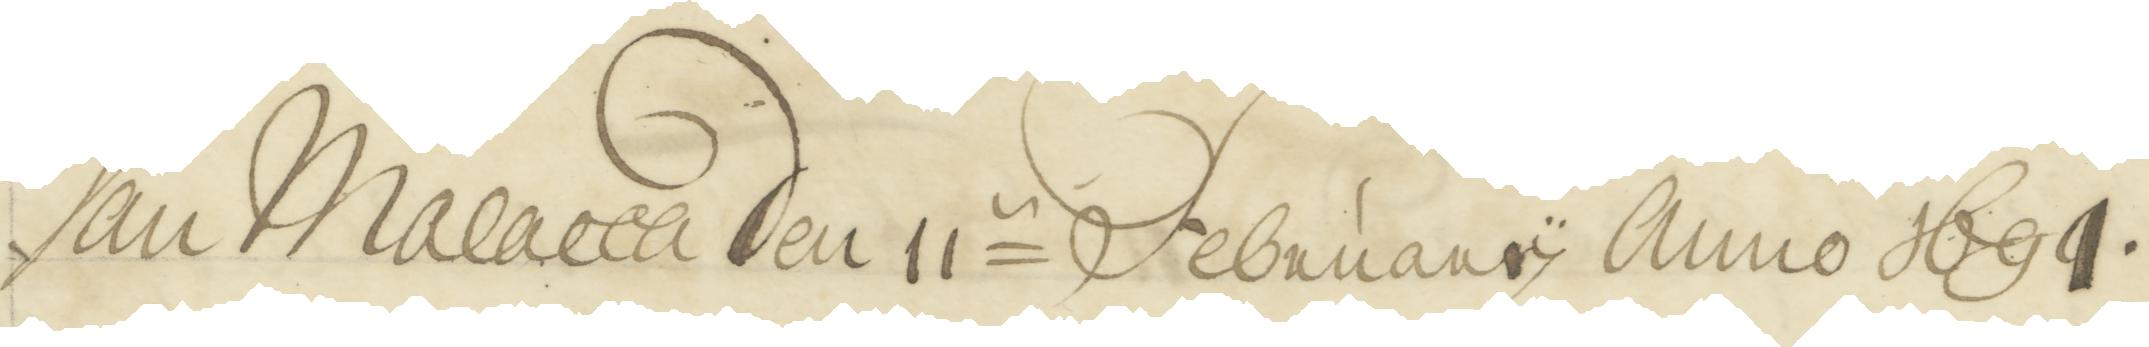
Van Malacca den 11=e Februarij Anno 1694.
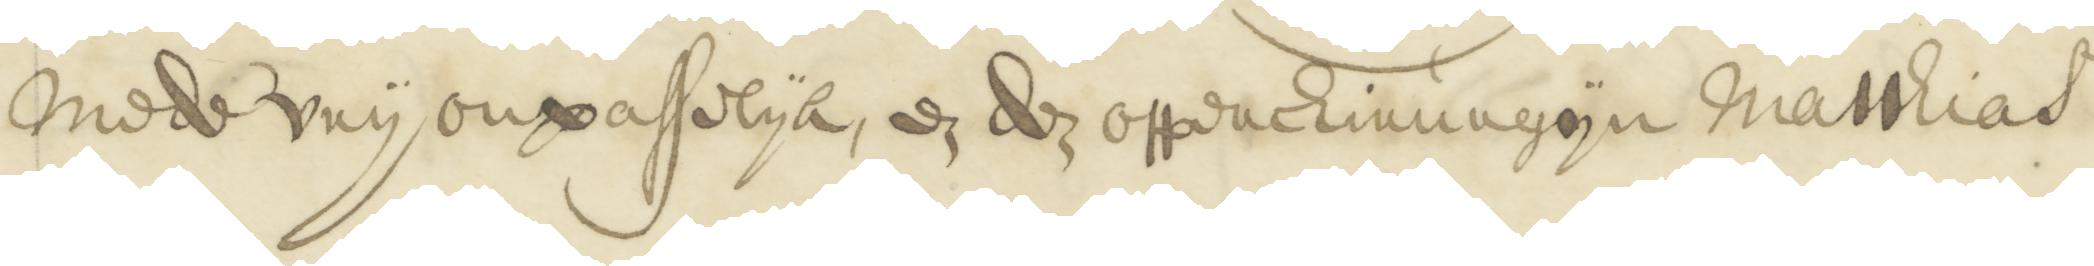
mede vrij onpasselijk, en den opperchirurgijn Matthias
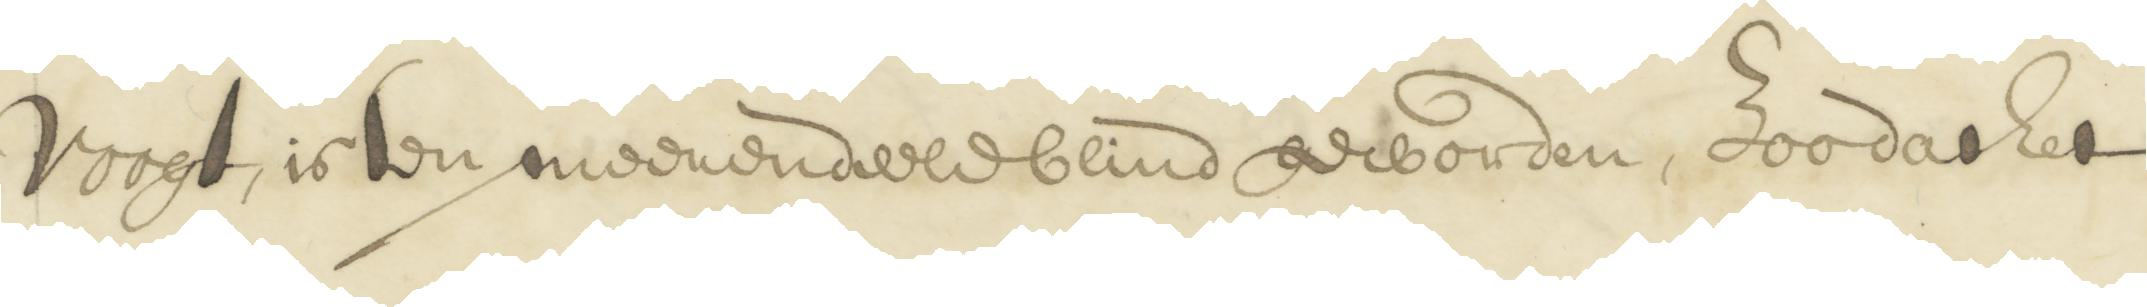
Voogt, is ten meerendeele blind geworden, Zoo dat het
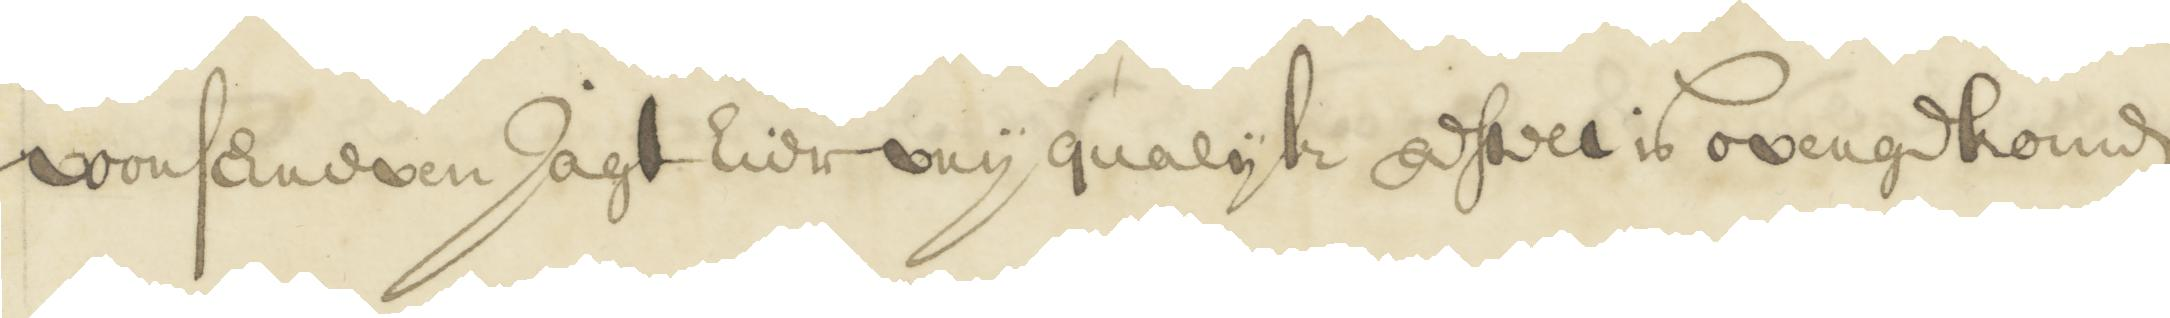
voorschreven Jagt hier vrij qualijk gestelt is overgekomen
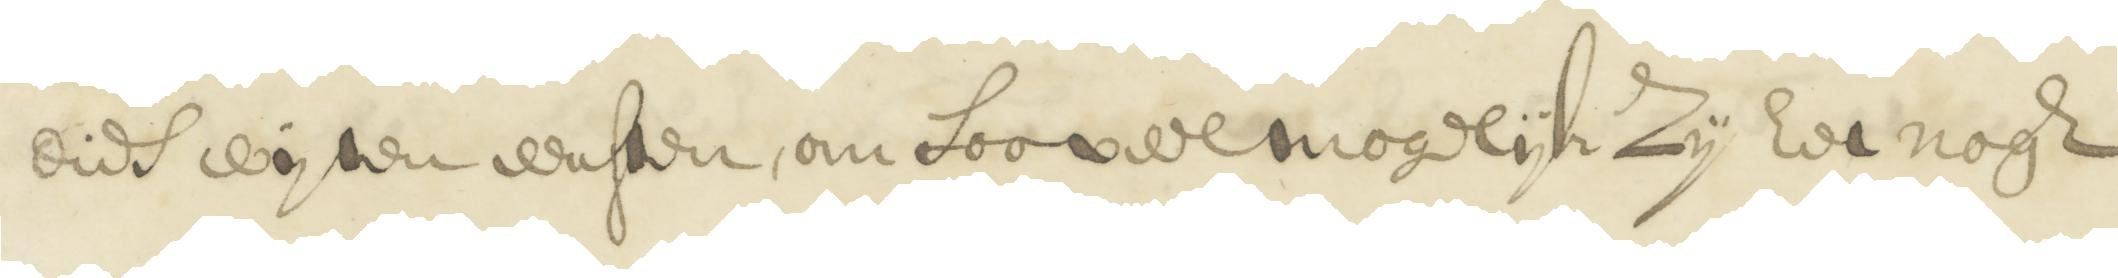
dies wij ten eersten, om Soo veel mogelijk Zij het nogh
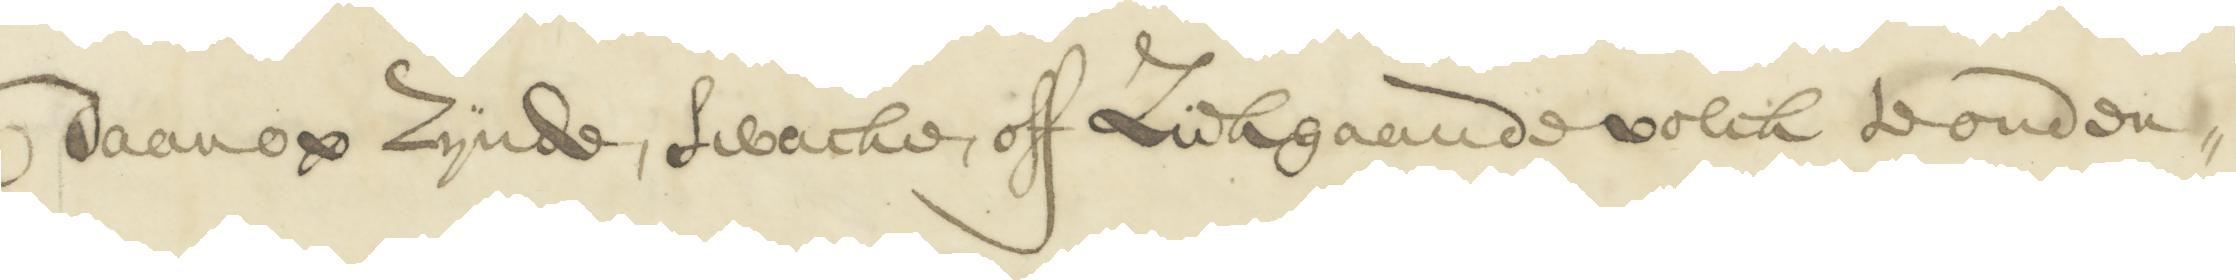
daarop Zijnde, swacke, off Ziekgaande volck te onder„
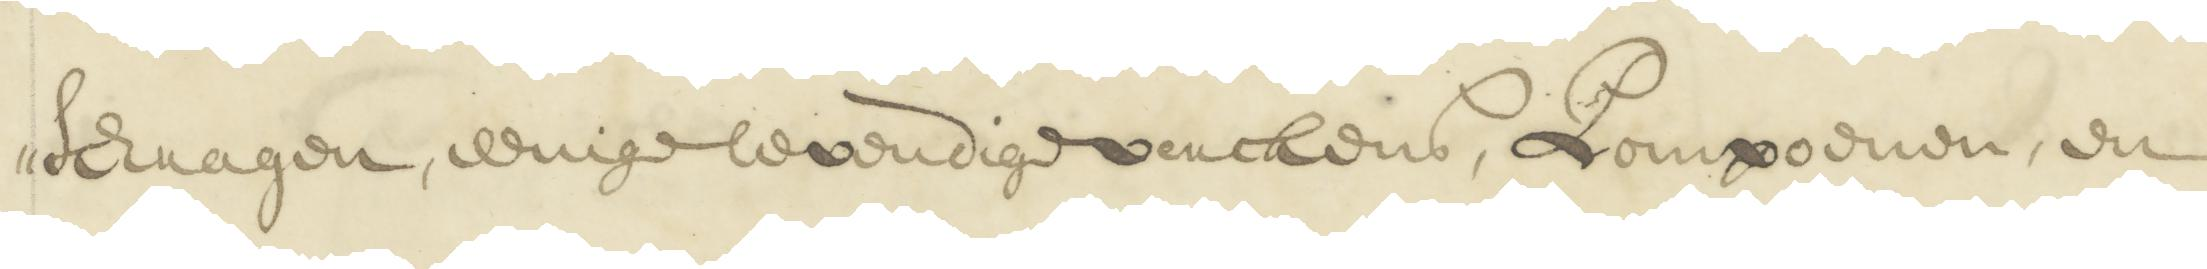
„schragen, eenige levendige verckens, Pompoenen, en
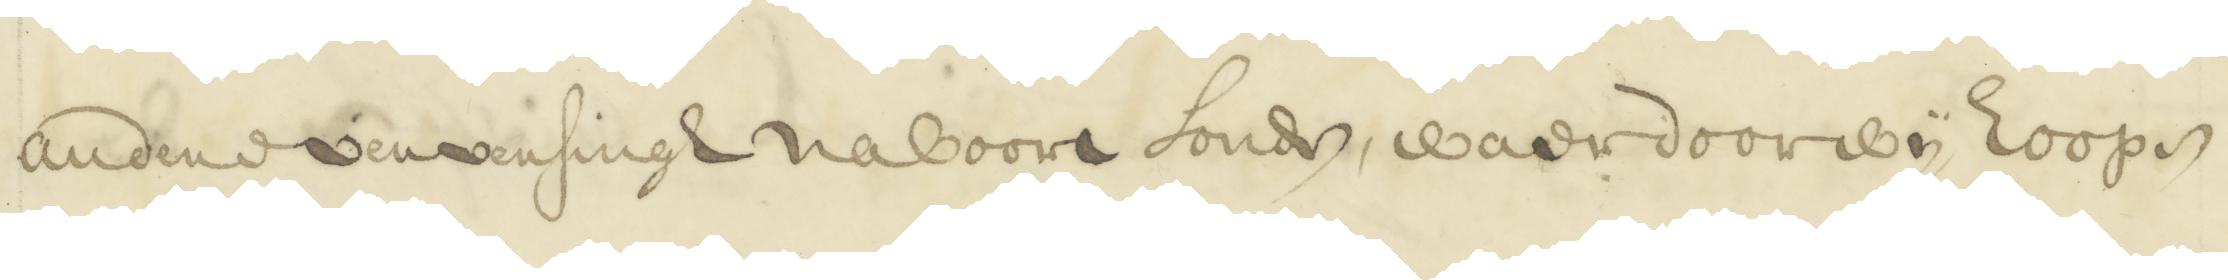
andere verversingh na boort Sonden, waer door wij hoopen
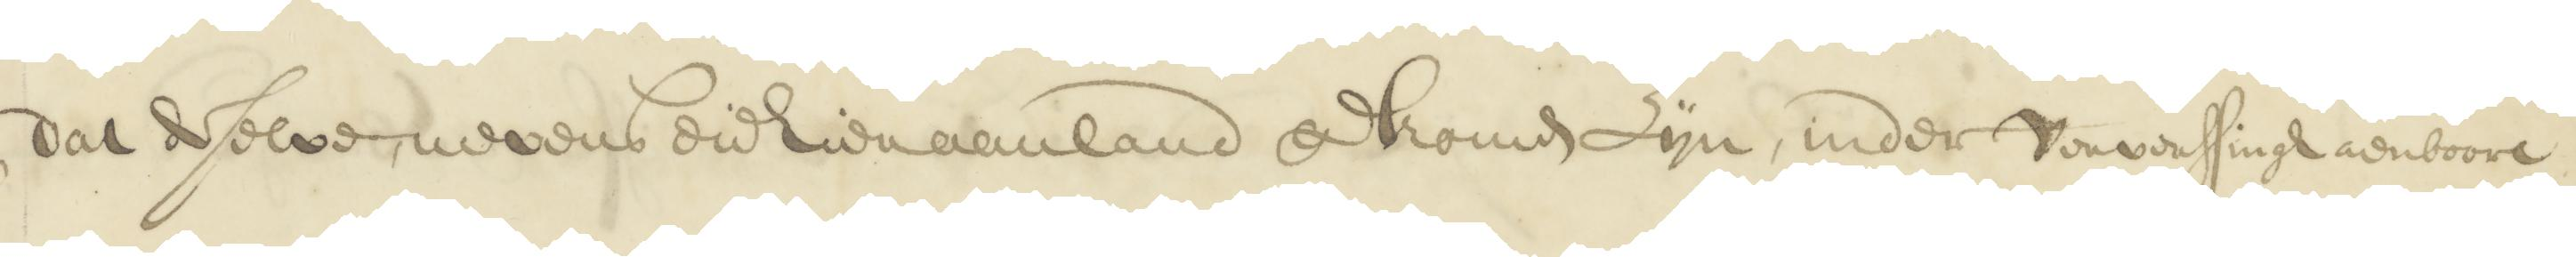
dat deselve, nevens die hier aanland gekomen Zijn, inder ververssingh aenboort
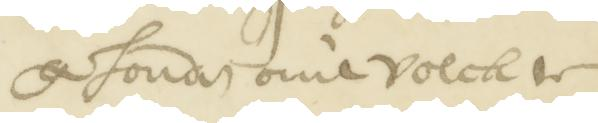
gesonden om't volck te
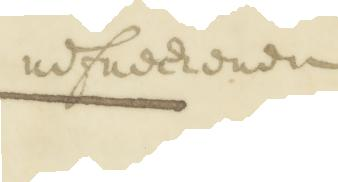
refrecheren
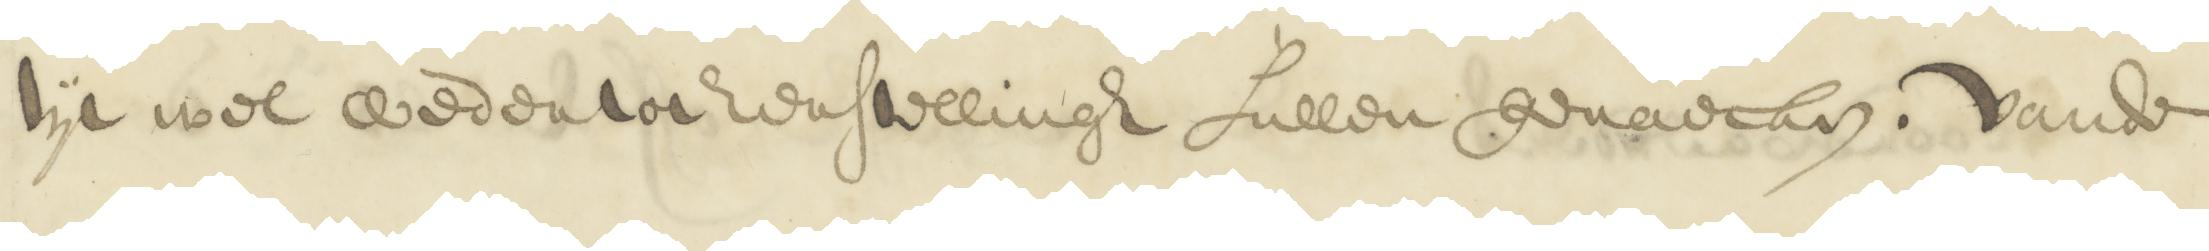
tijt wel weder tot herstellingh sullen geraecken, vande
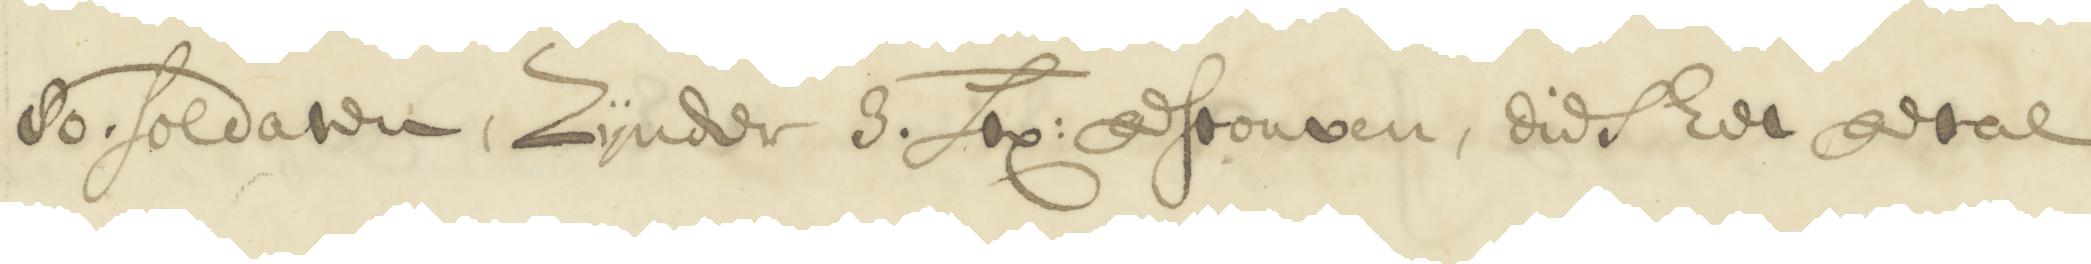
80. soldaten, Zijnder 3. stx: gestorven, dies het getal
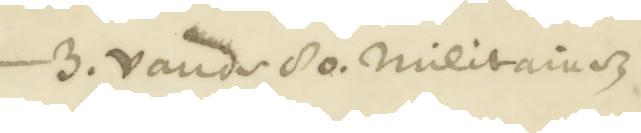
3. vande 80. militairen
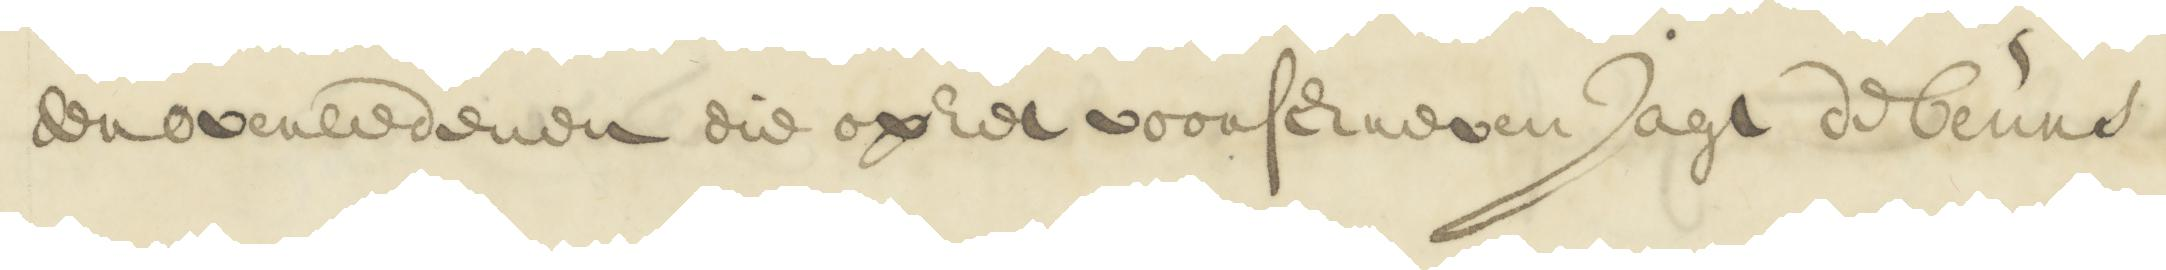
der overledenen die op het voorschreven Jagt de beurs
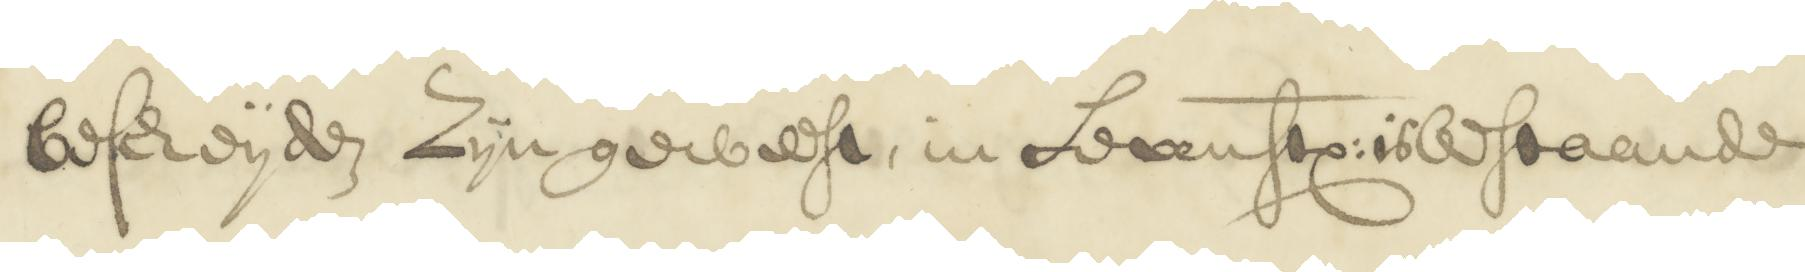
bescheijden Zijn geweest, in Seven stx: is bestaande
